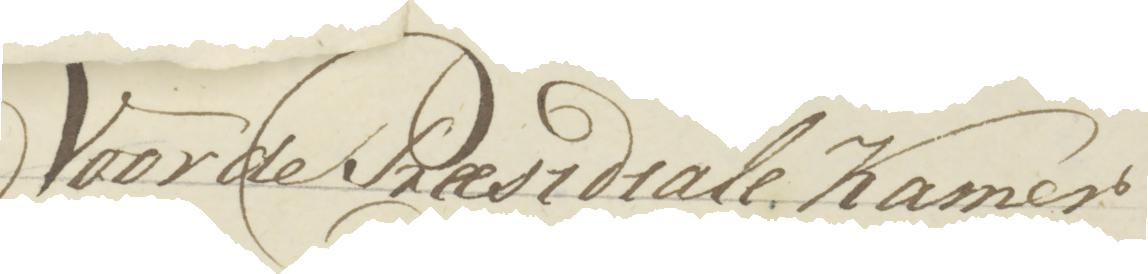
Voor de Reesidiale Kamer
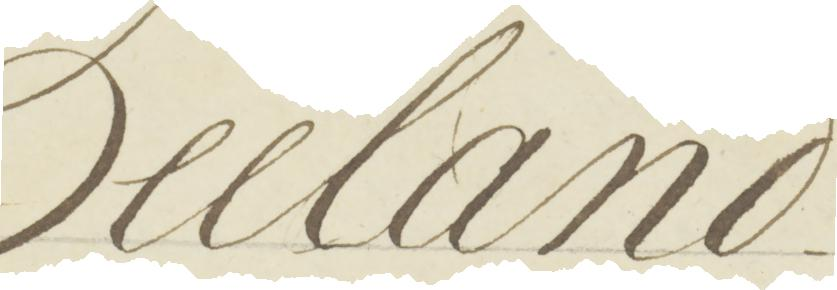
Seeland
